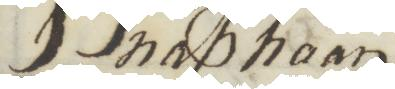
1 Snaphaan
